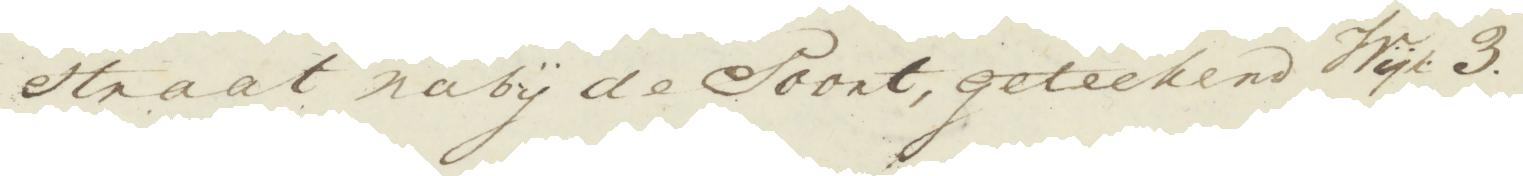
straat nabij de Poort, geteekend wijk 3.
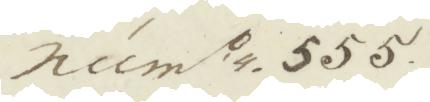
num.o„. 555.
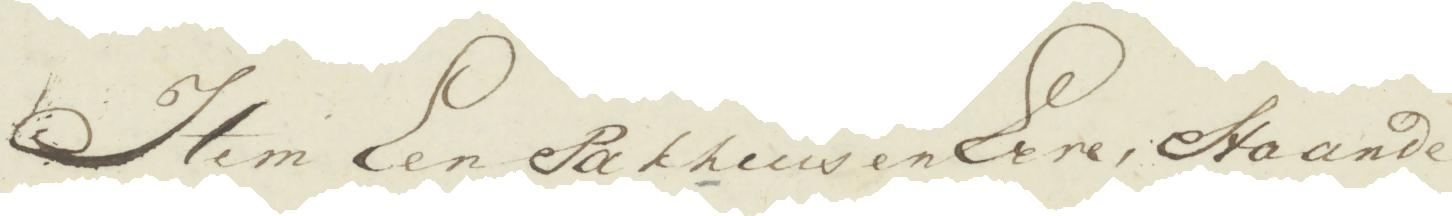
Item Een Pakhuis en Erve, staande
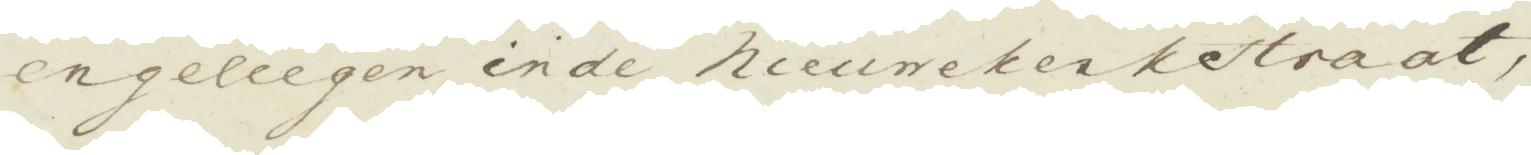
en geleegen in de nieuwe kerstraat,
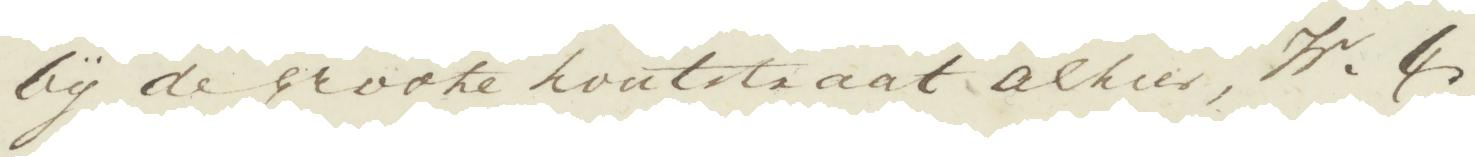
bij de groote houtstraat alhies, W. 4.
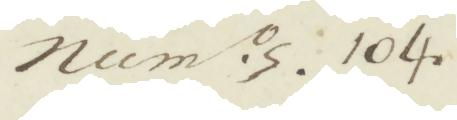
num.o„. 104.
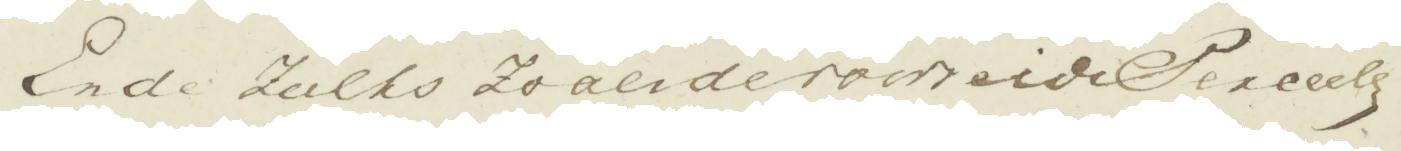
Ende zulks zo als de voorseide Perceelen
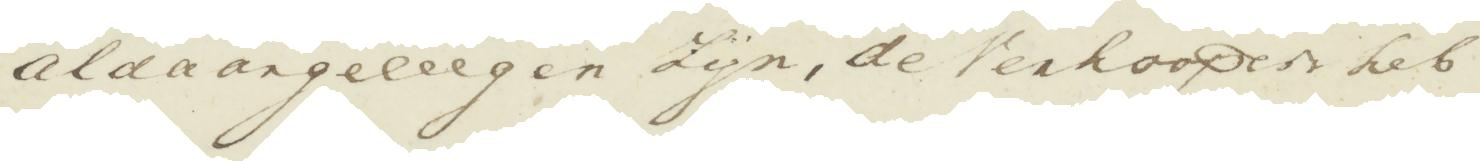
aldaar geleegen zijn, de verkoopen heb
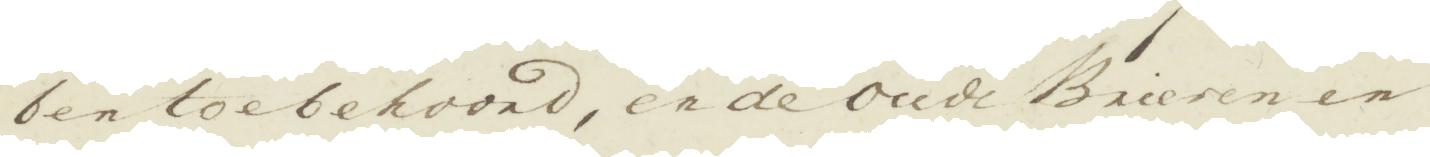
ben toebehoord, en de oude Brieven en
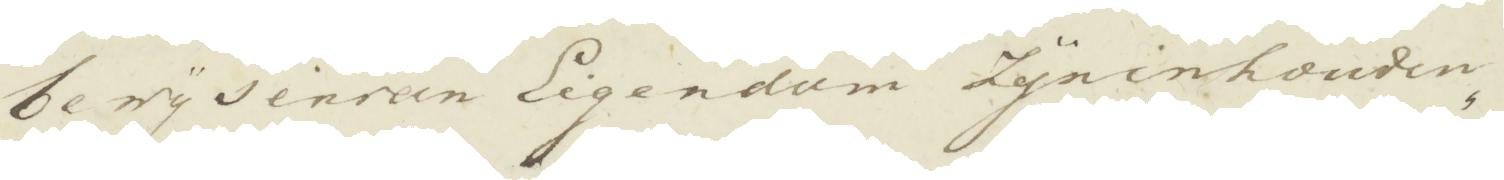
bewijsen van Eigendom zijn inhouden„
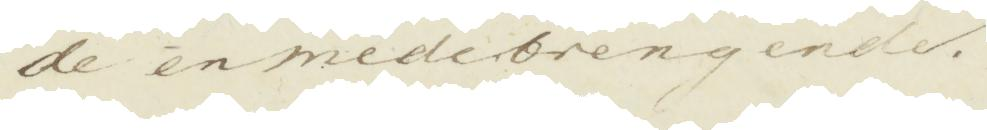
de en medebrengende.
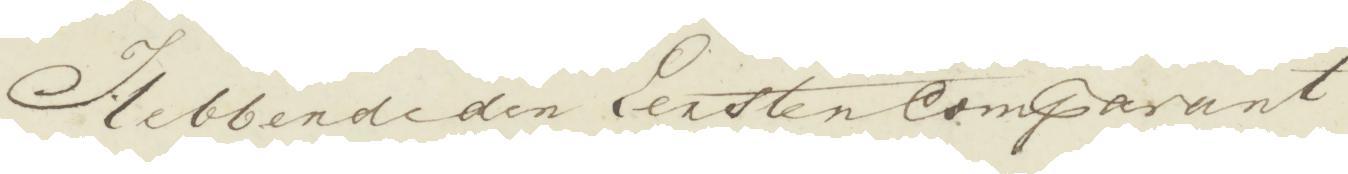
Hebbende den Eersten comparant
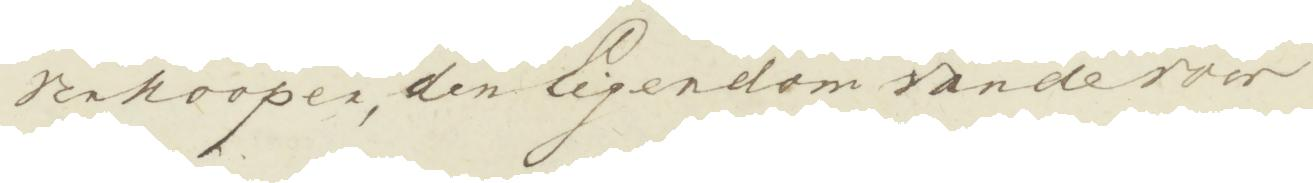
verkoopen, den Eigendom van de voor
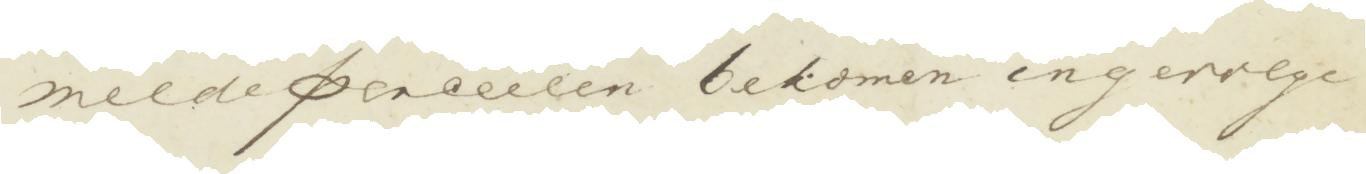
melde perceelen bekomen ingevolge
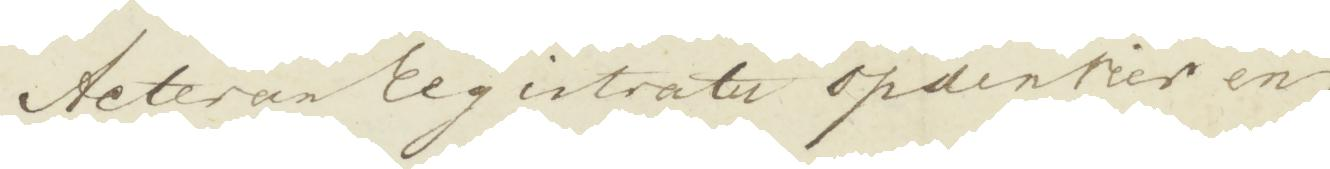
Acte van registratie op den vier en
